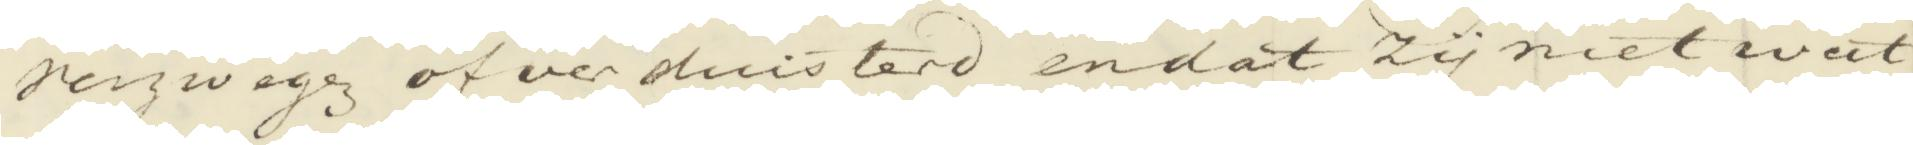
verzwegen of ver duisterd en dat zij niet wat
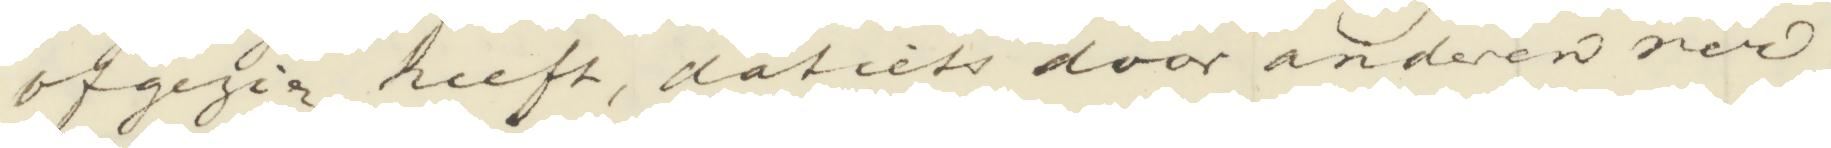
of gezien heeft, dat iets door anderen ver
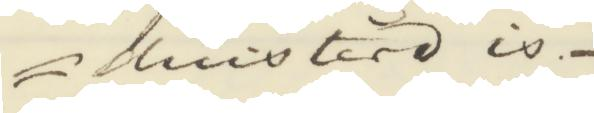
=duisterd is.-
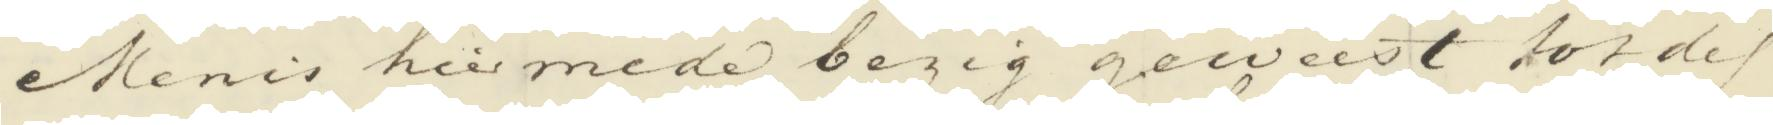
Men is hier mede bezig geweest tot des
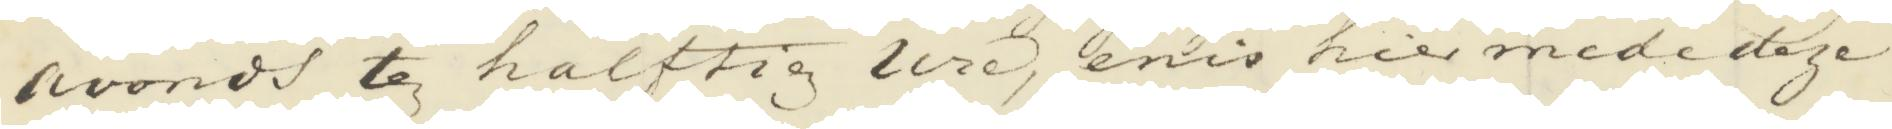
avonds ten halftien ure, en is hier mede deze
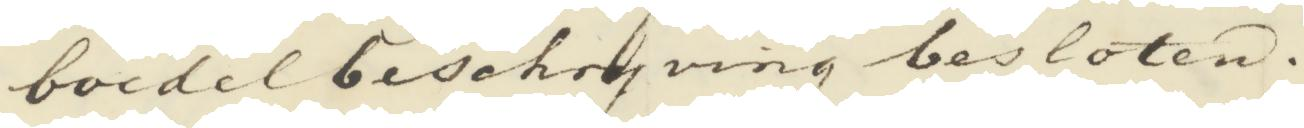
boedel beschryving besloten.
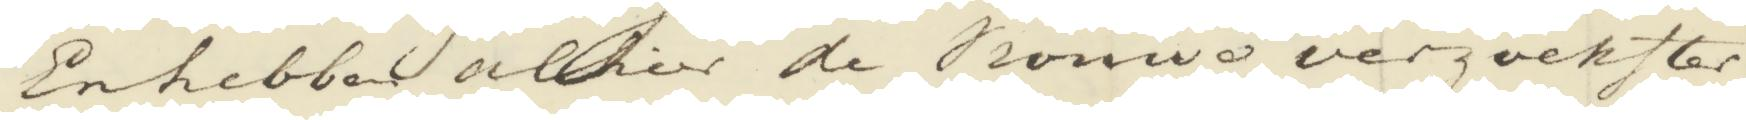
En hebben alhier de Vrouwe verzoekster
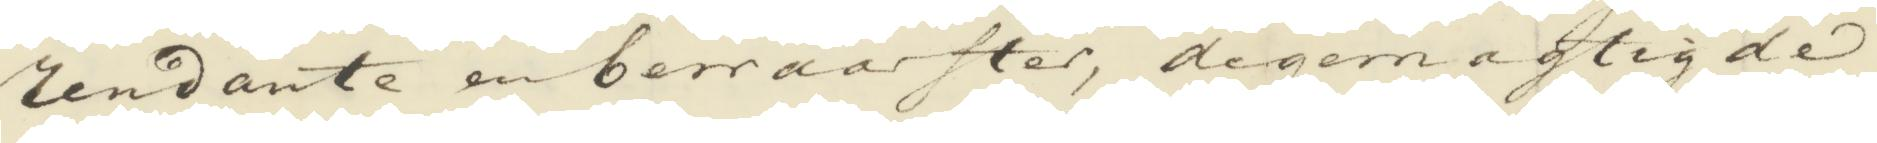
rendante en bewaarster, de gemagtigde
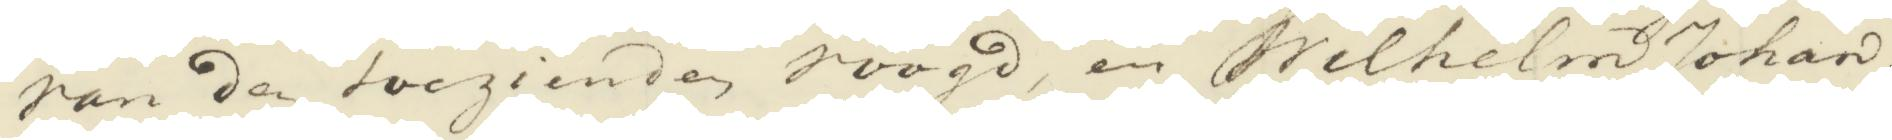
van den toezienden voogd, en Wilhelm Johan
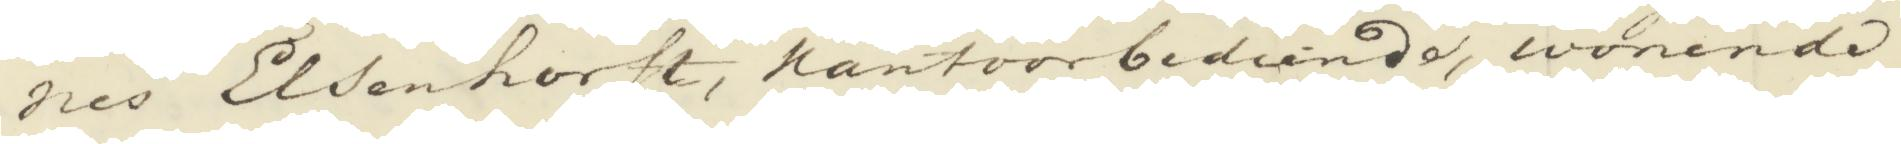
nes Elsenhorst, kantoorbediende, wonende
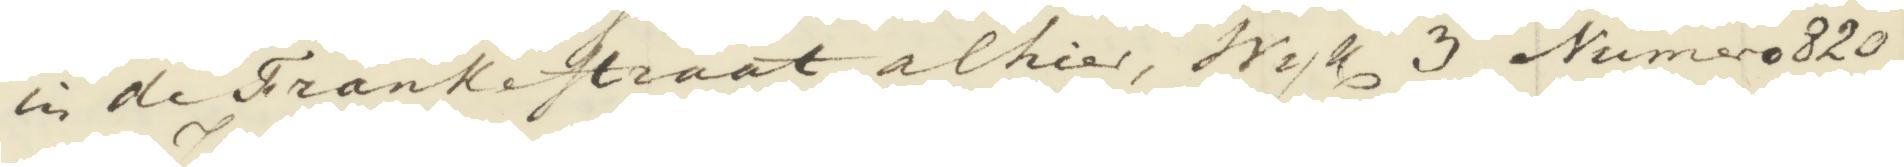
in de Frankestraat alhier, Wyk 3 Numero 820
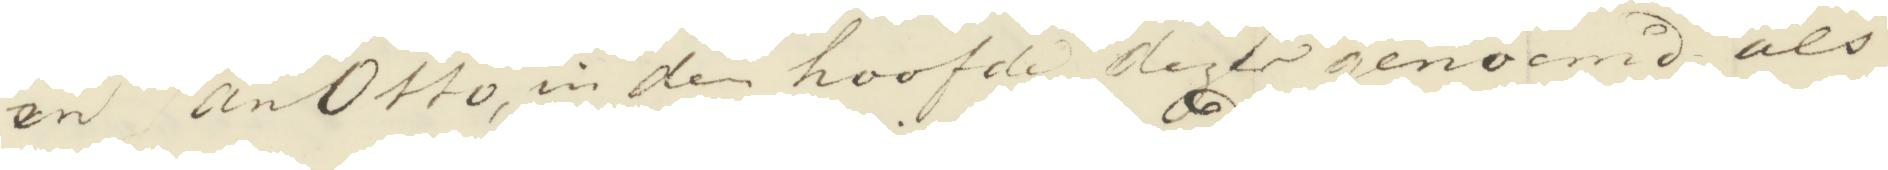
en Jan Otto, in den hoofde dezer genoemd als
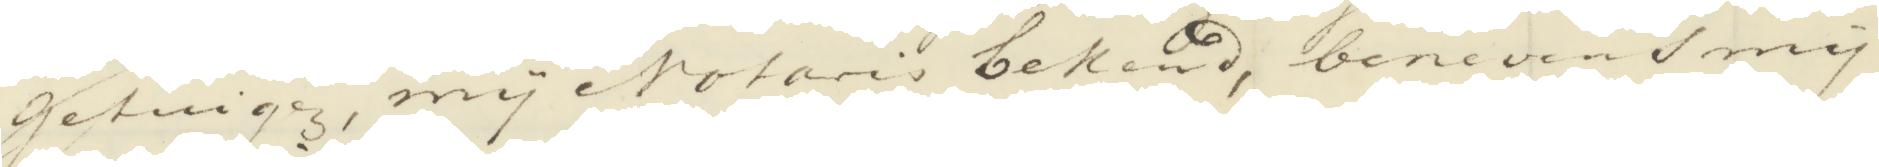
getuigen, mij Notaris bekend, benevens mij
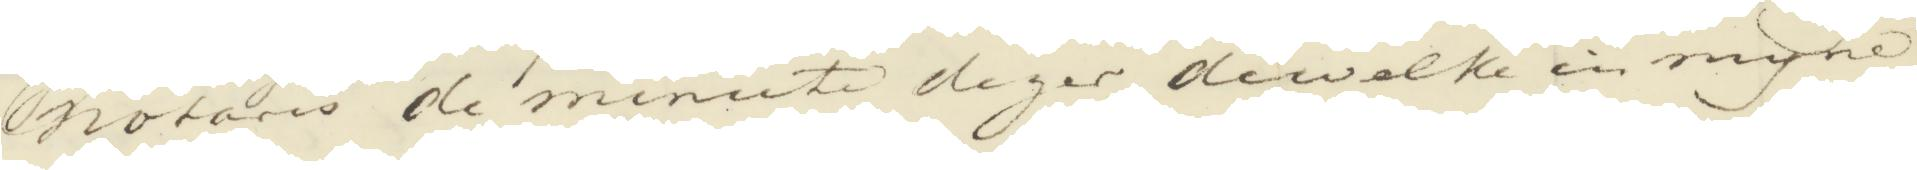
notaris de minute dezer, dewelke in myne
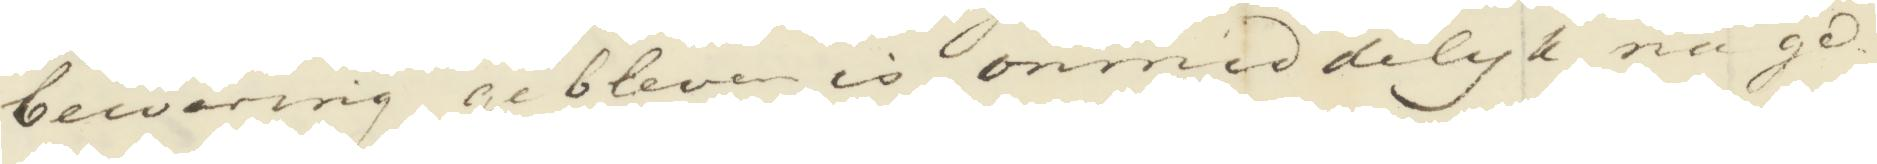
bewaring gebleven is, onmiddelyk na ge„
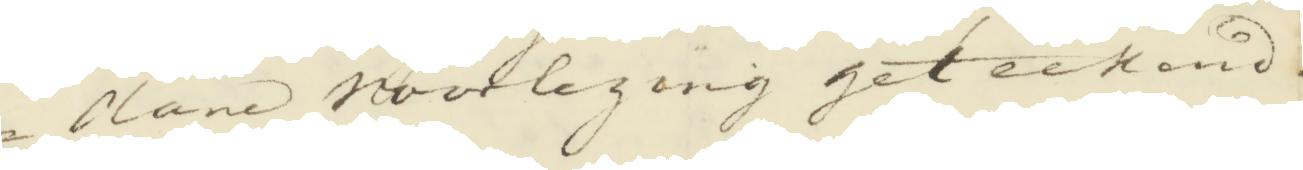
=dane voorlezing geteekend.
